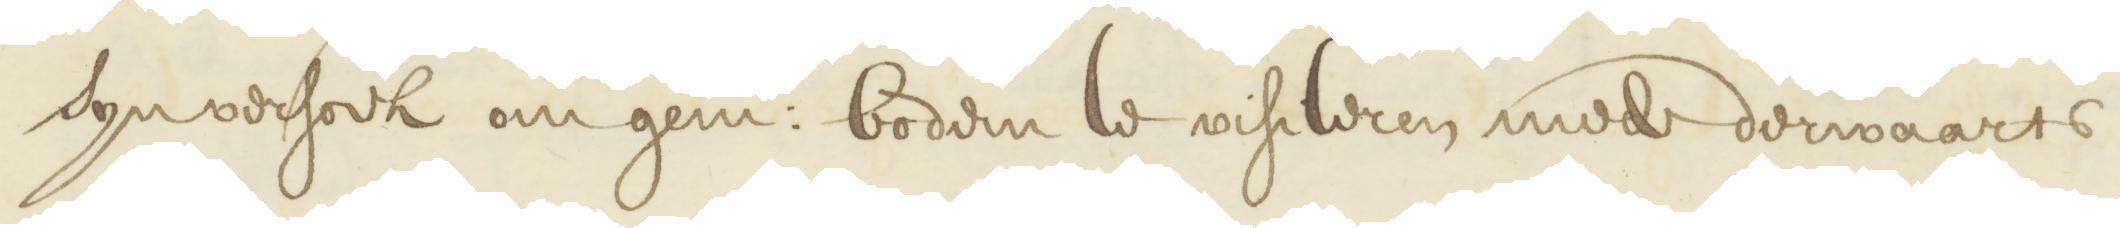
syn versoek om gem: bodem te visiteren mede derwaarts
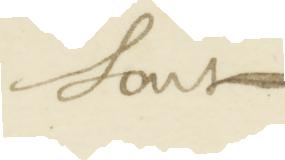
sont
